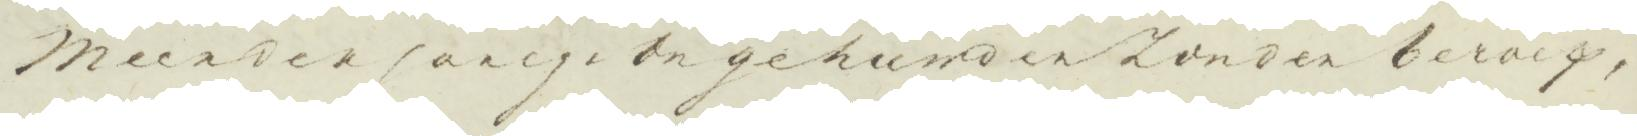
Meerder jarige ongehuwd en zonder beroep,
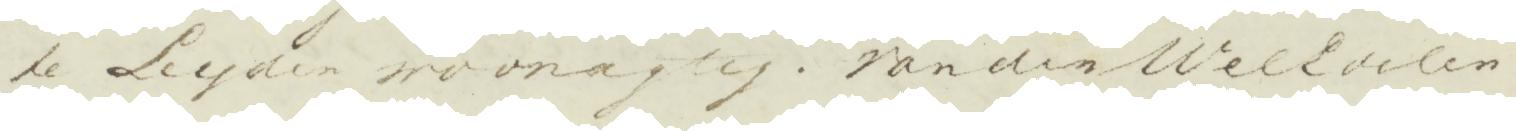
te Leyden woonagtig. van den WelEdelen
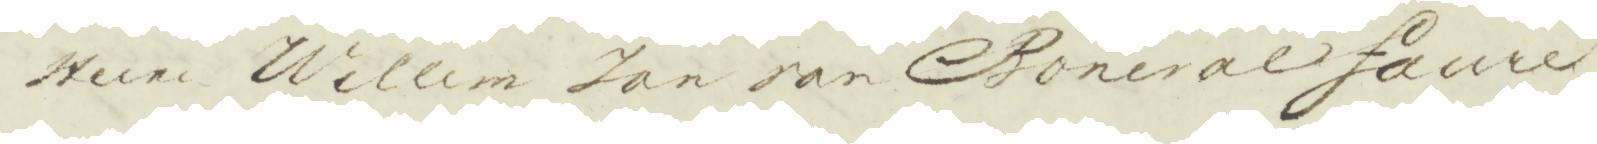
Heere Willem Jan van Boneval Faure,
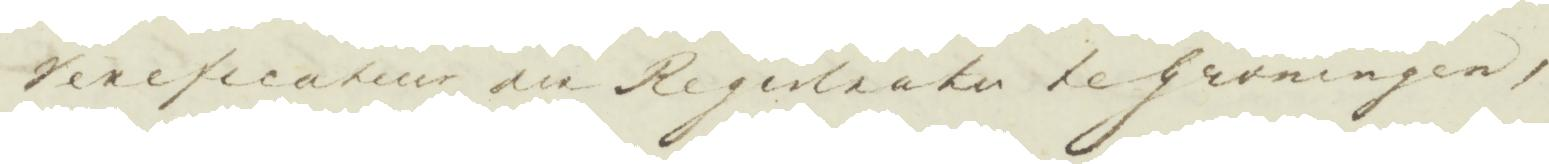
vereficateur der Registratie te Groningen,
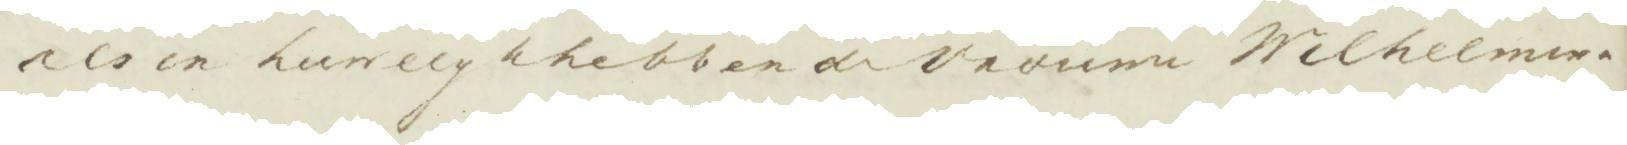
als in huwelyk hebbende vrouwe Wilhelmina
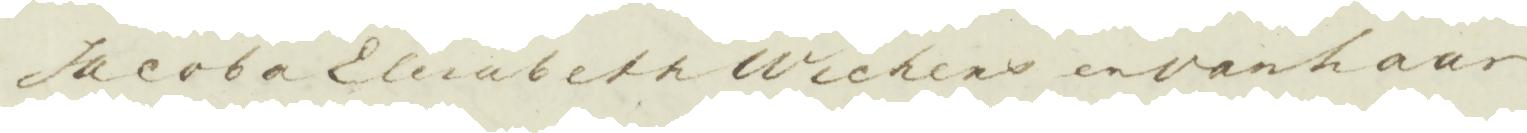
Jacoba Elisabeth Wickers en van haar
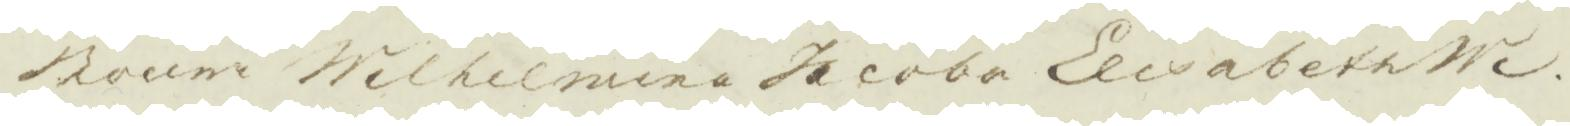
Vrouwe Wilhelmina Jacoba Elisabeth Wi.
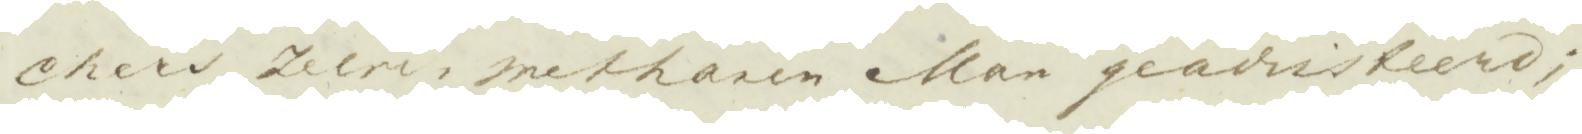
chers zelve, met haren Man geadsisteerd;
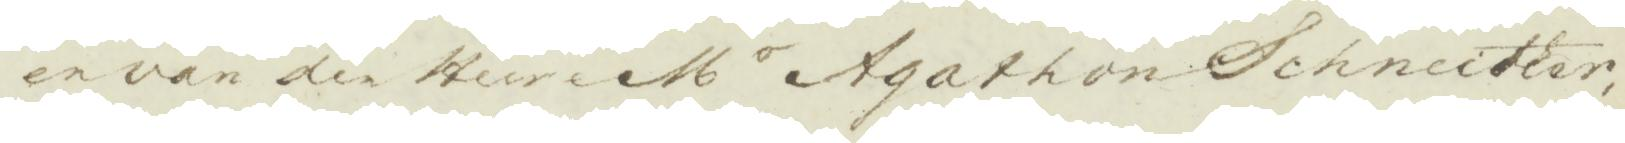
en van den Heere Ms Agathon Schneither,
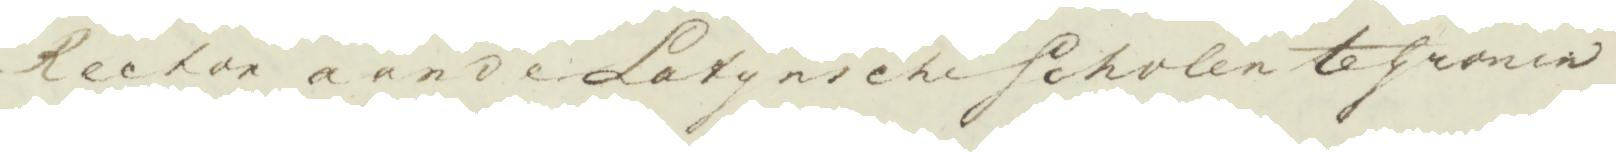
Rector aan de Latynsche Scholen te Gronin
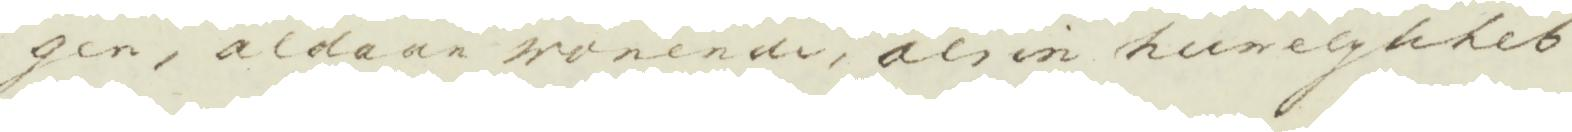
gen, aldaar wonende, als in huwelyk heb
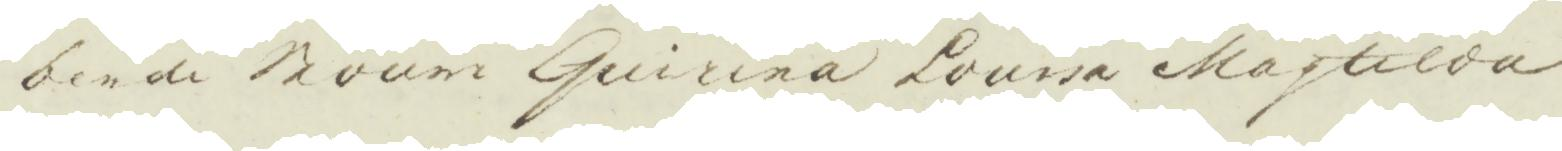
bende Vrouwe Quirina Louisa Magtilda
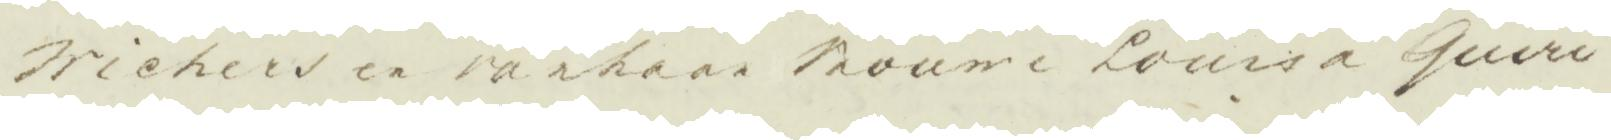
wichers en van haar Vrouwe Louisa Quiri
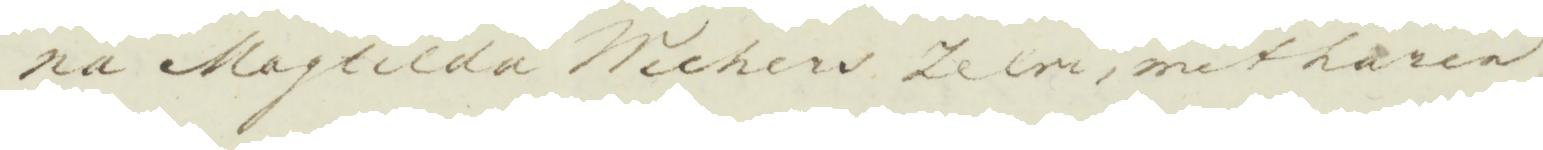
na Magtilda Wichers zelve, met haren
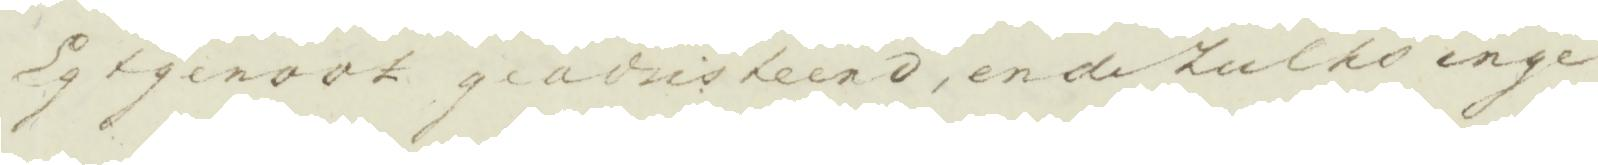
Egtgenoot geadsisteerd, ende zulks inge
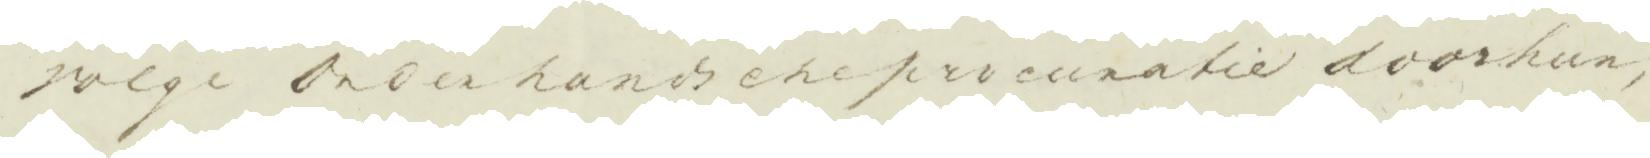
volge onderhandsche procuratie door hun,
